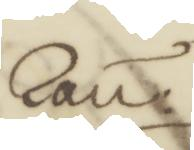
Ian:
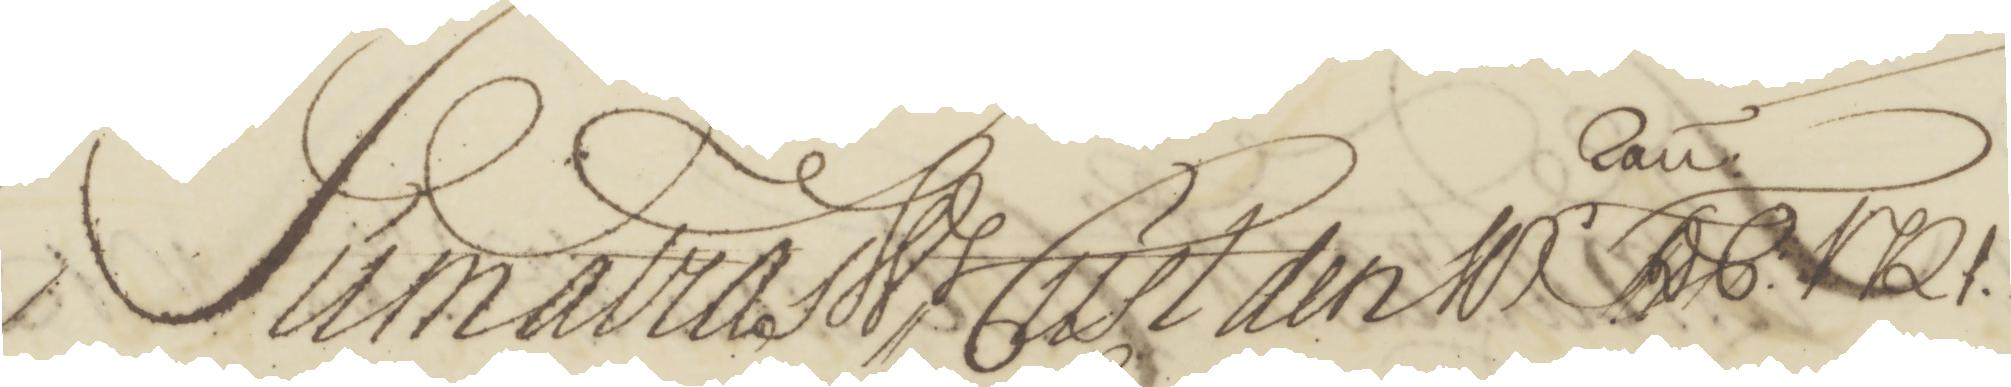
Sumatras W:t Cust den 18' xb: 1721.
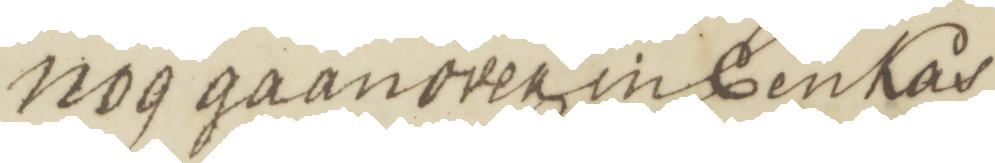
nog gaan over in Een kas
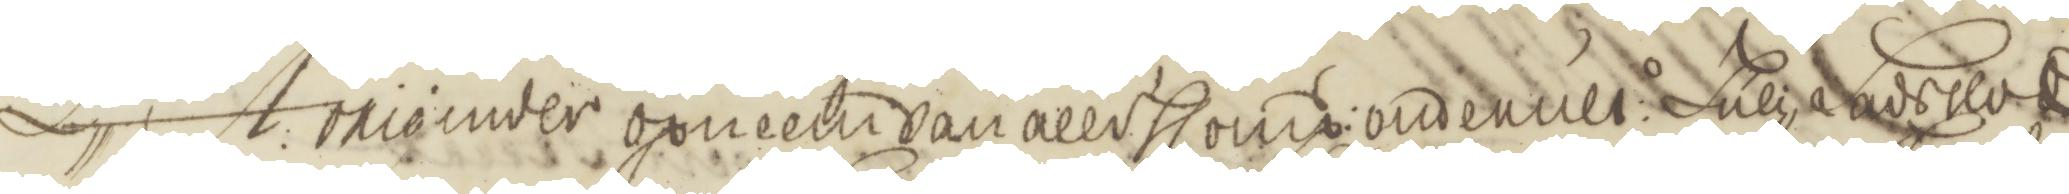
L„ta A. originele opneem van alle 'sComp:s onder ult:o Julij laestleden
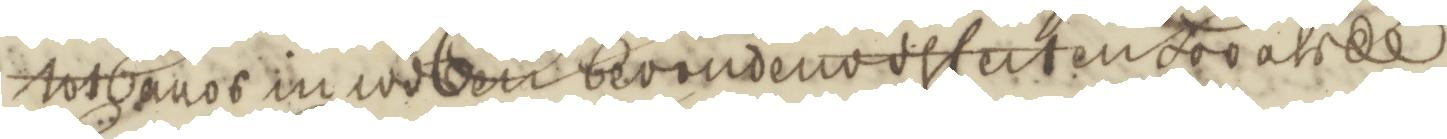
tot baros in welken bevondene effecten soo als de
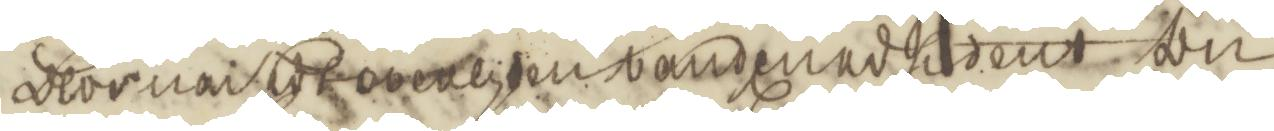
selve naisy toverlijden vanden resident ten
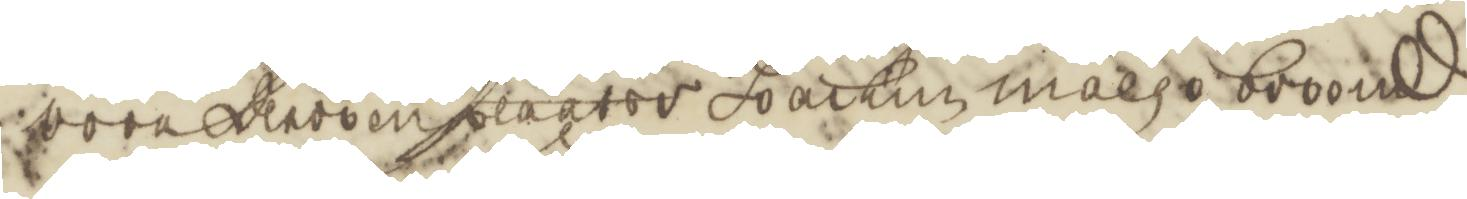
voorschreven plaatse zo als in maeyo bevonden
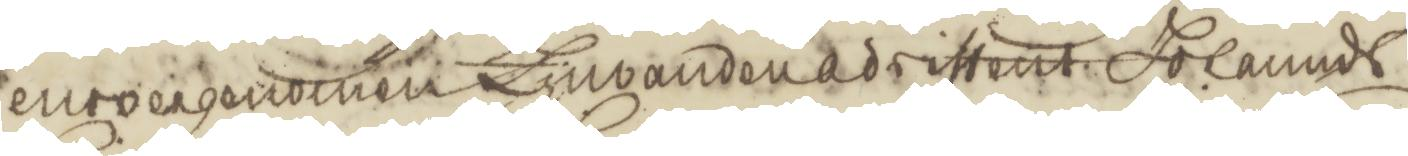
en overgenomen zijn vanden adsistent. Johannes
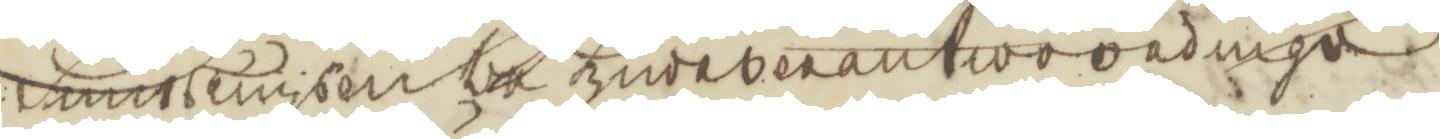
Smitshuijsen ter sijner verantwoordinge
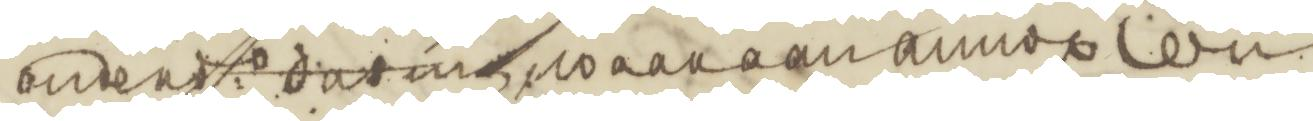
onder d:o datum, waar aan annex een
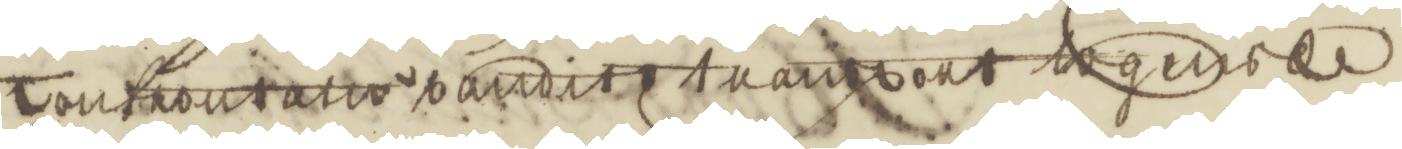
confrontatie van dit transport tegens de
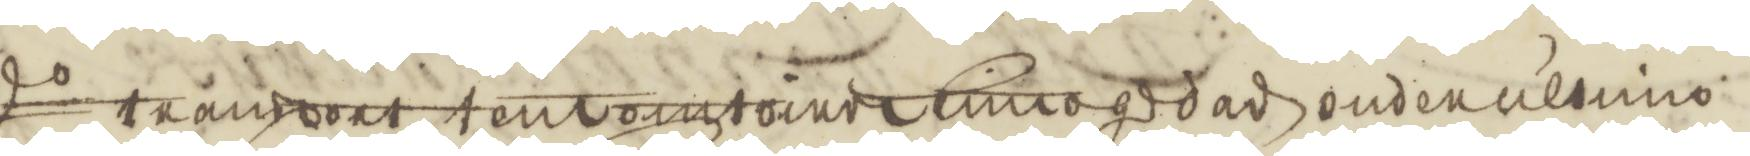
d=o transport ten comtoiren chinco gedaen onder ultimo
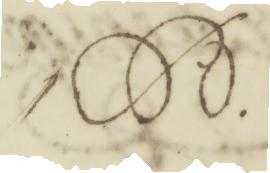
B
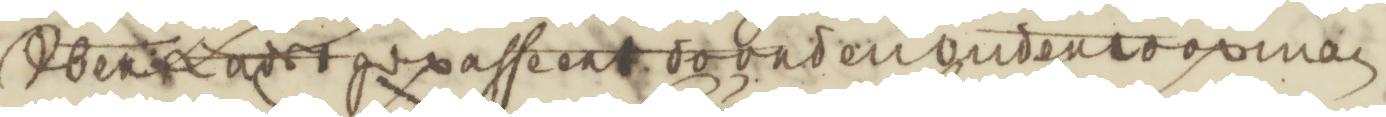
7ber laest gepasseert door den ondercoopman
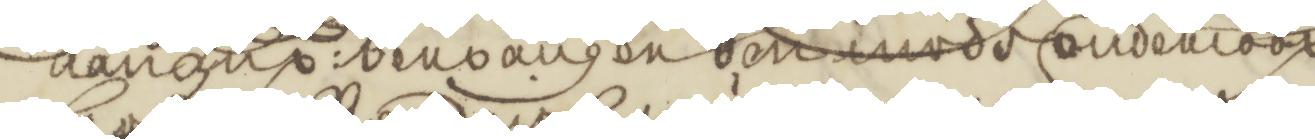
en opperhoofd matteus van hoogstraten
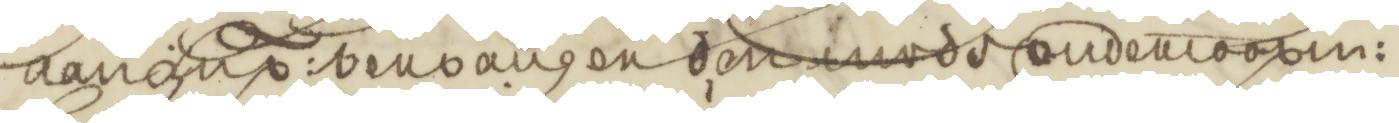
aan syn p: vervanger den mede ondercoopm:
